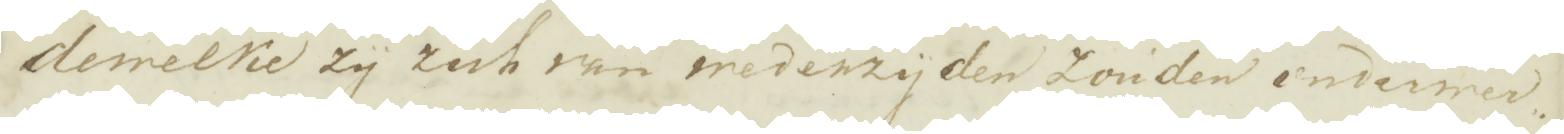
dewelke zij zich van wederzijden zouden onderwer„
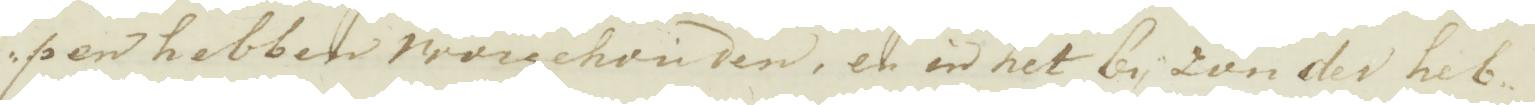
„pen hebben voorgehouden, en in het bijzonder heb„
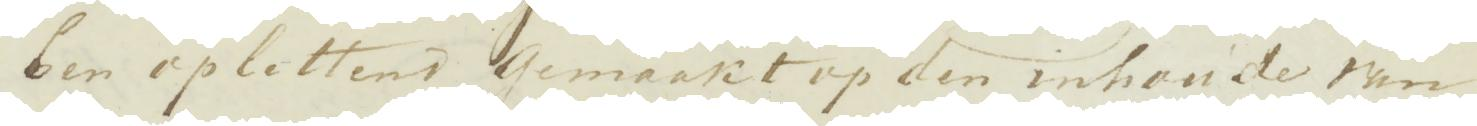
ben oplettend gemaakt op den inhoude van
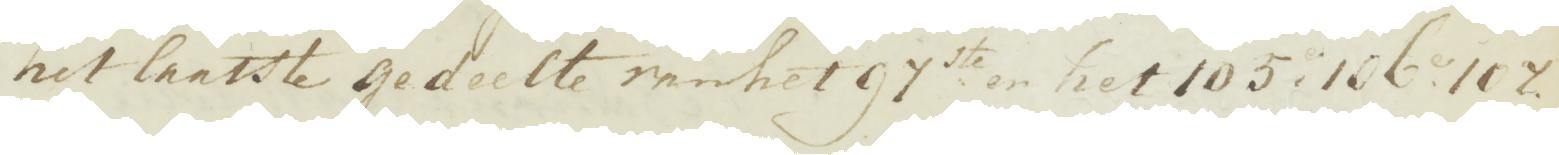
het laatste gedeelte van het 97:ste en het 105:e 106.e 107.
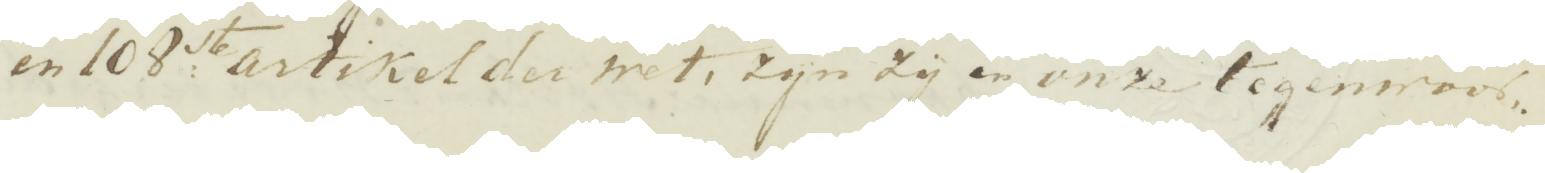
en 108:ste artikel der wet, zijn zij in onze tegenwoor„
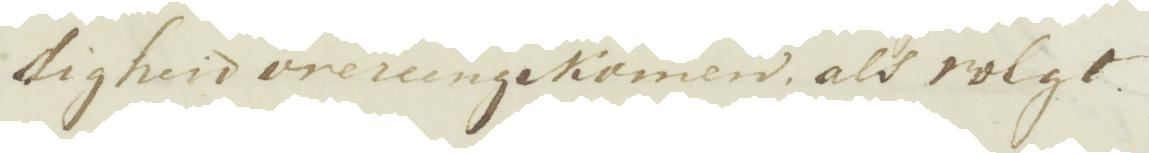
digheid overeengekomen, als volgt.
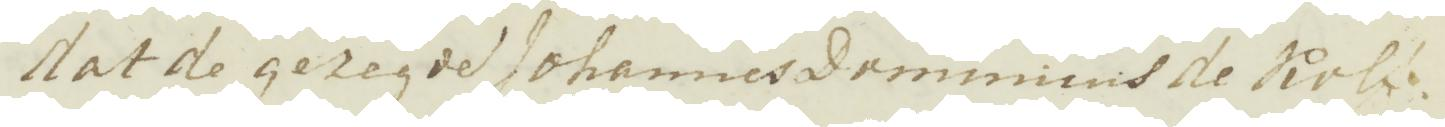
dat de gezegde Johannes Dominius de Kolf.
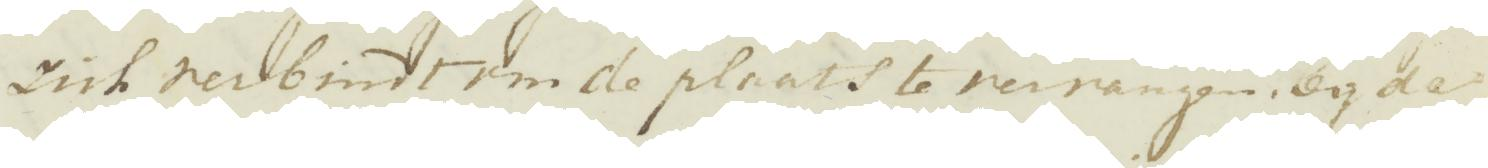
zich verbindt om de plaats te vervangen, by de
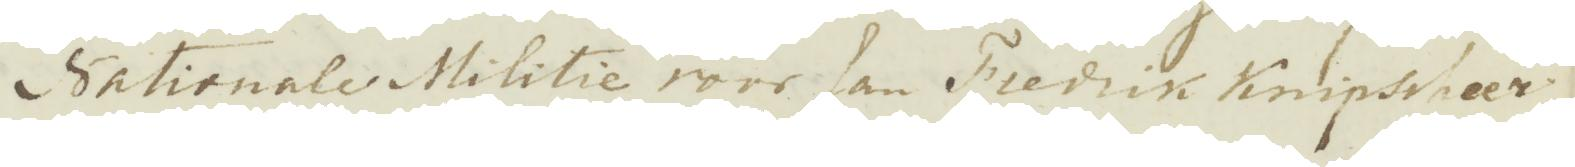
Nationale Militie voor Jan Fredrik Knipscheer:
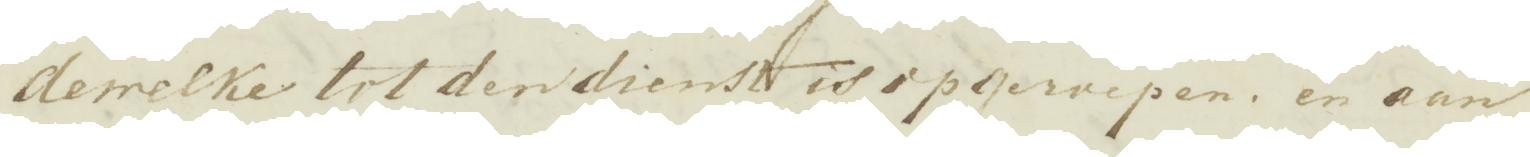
dewelke tot den dienst is opgeroepen, en aan
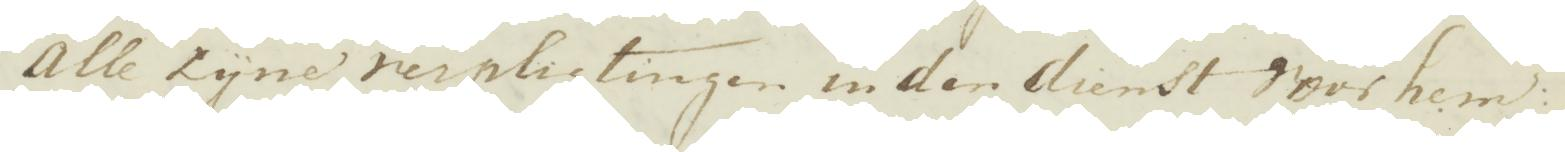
alle zijne verpligtingen in den dienst voor hem:
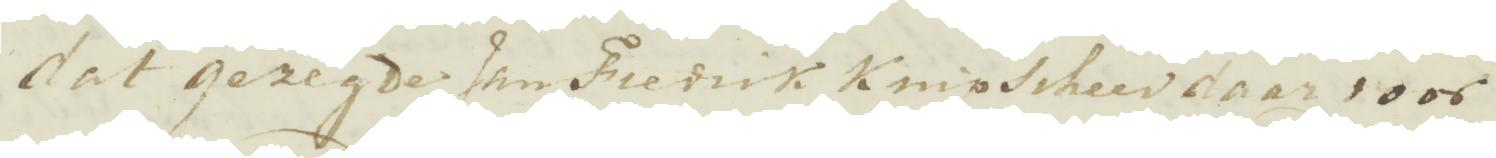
dat gezegde Jan Fredrik Knipscheer daar voor
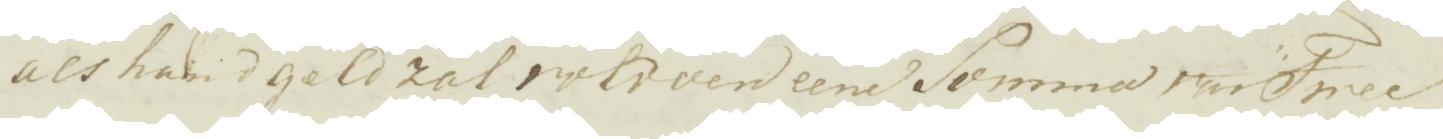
als handgeld zal voldoen eene Somma van Twee
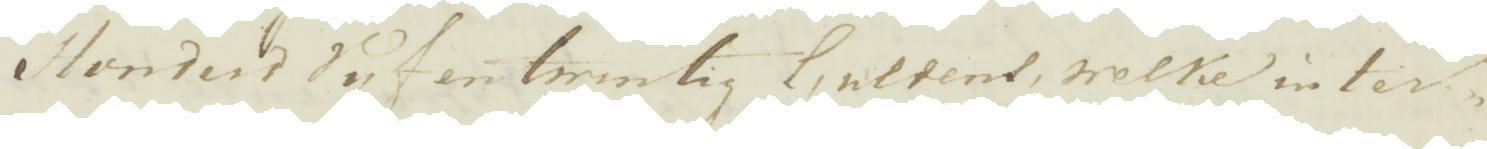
Honderd Vyf en twintig Guldens, welke in ter„
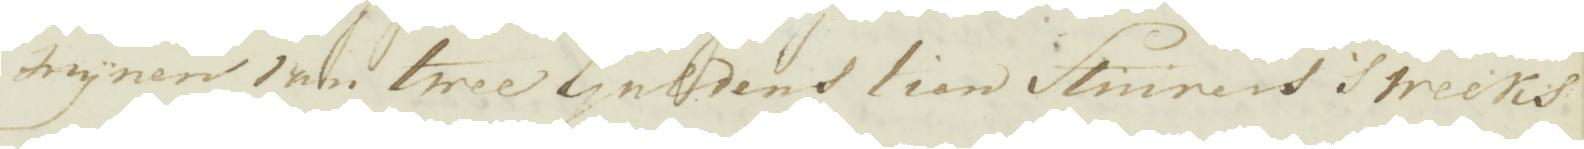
mijnen van twee Guldens tien Stuivers 's weeks
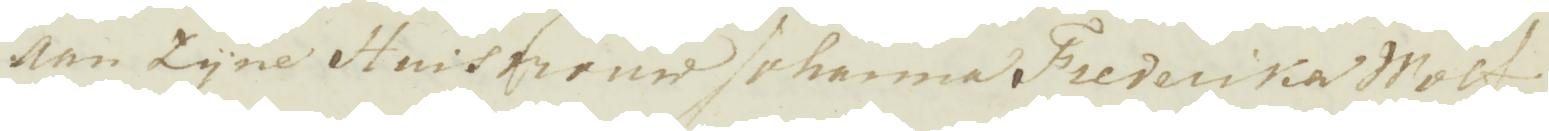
Aan Zijne Huisvrouw Johanna Frederika Wolf
